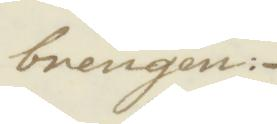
brengen:
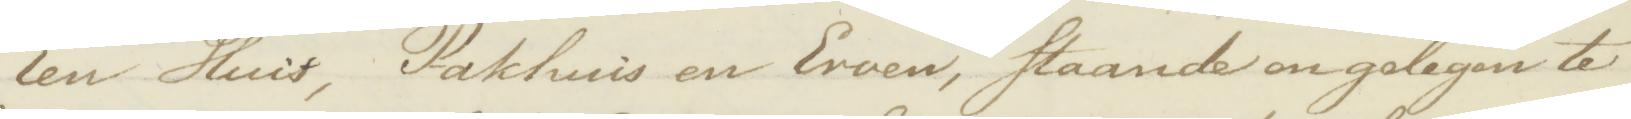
Een Huis, Pakhuis en Erven, Staande en gelegen te
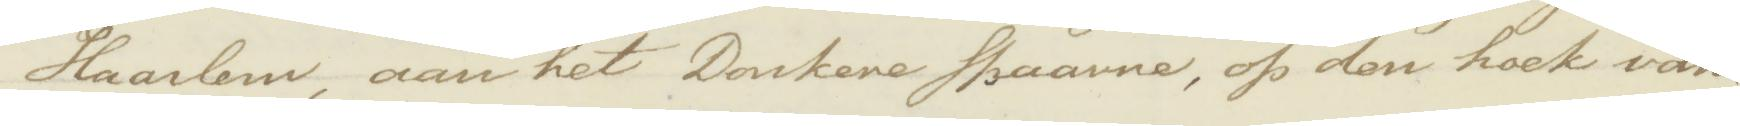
Haarlem, aan het Donkere Spaarne, op den hoek van
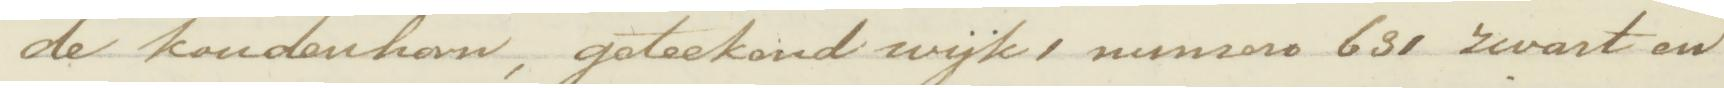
de koudenhorn, geteekend wijk 1 numero 631 zwart en
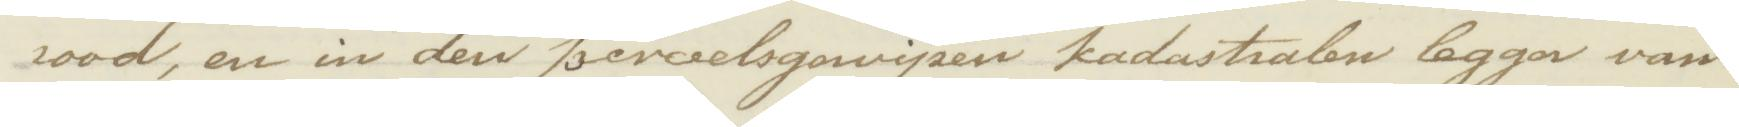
rood, en in den perceelsgewijzen kadastralen legger van
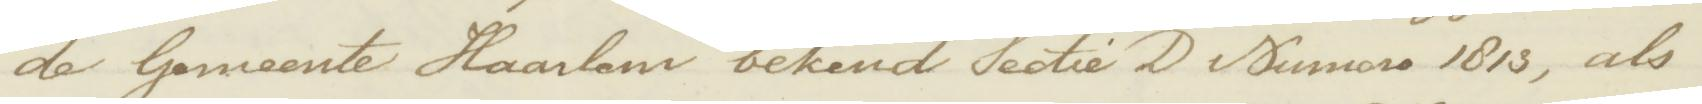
de Gemeente Haarlem bekend sectie D Numero 1813, als
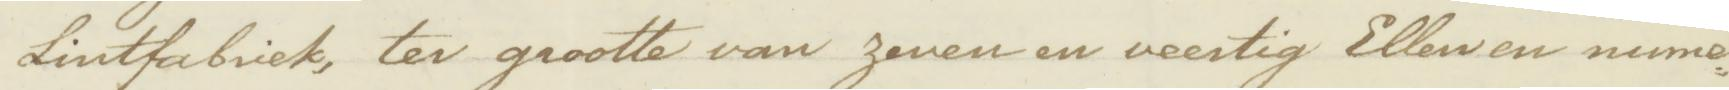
Lintfabriek, ter grootte van zeven en veertig Ellen en nume„
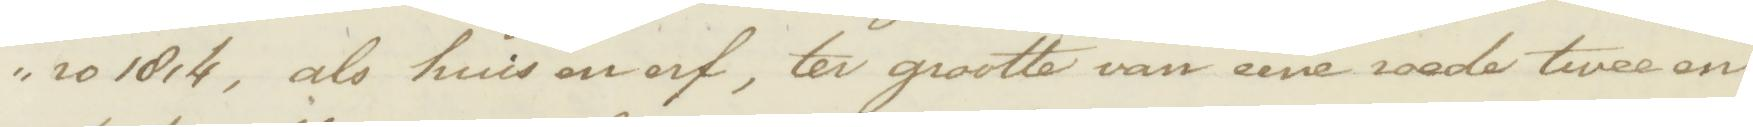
„ro 1814, als huis en erf, ter grootte van eene roede twee en
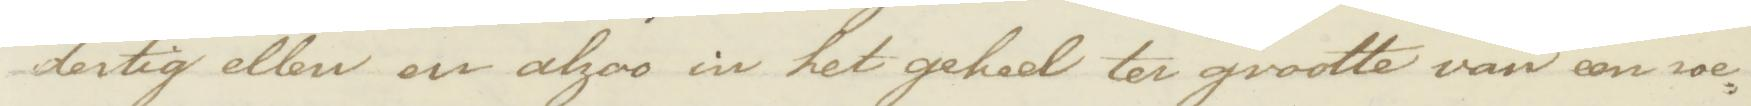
dertig ellen en alzoo in het geheel ter grootte van een roe„
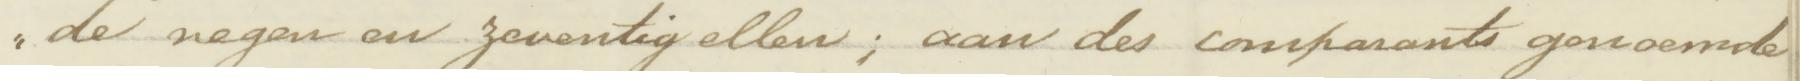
„de negen en zeventig ellen; aan des comparants genoemde
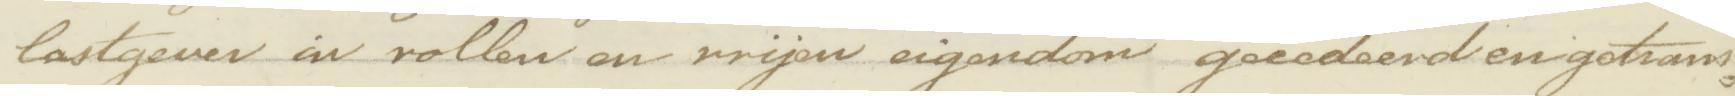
lastgever in vollen en vrijen eigendom gecedeerd en getrans
